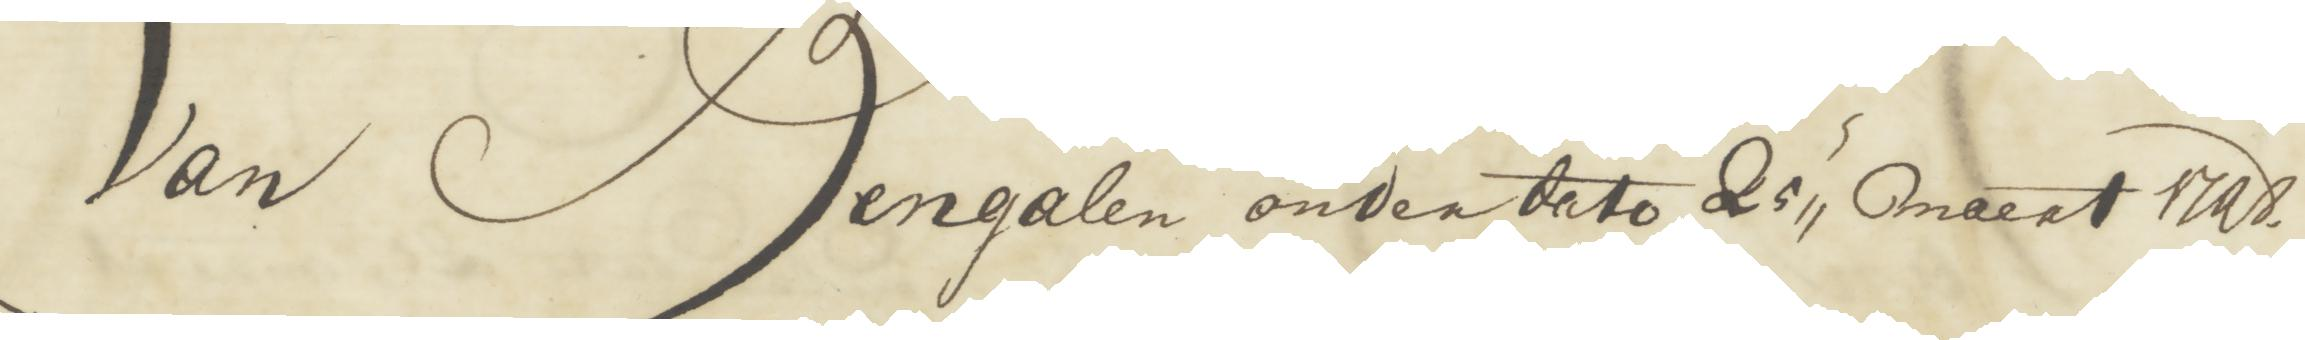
Van Bengalen onder dato 25„' Maert 1748.
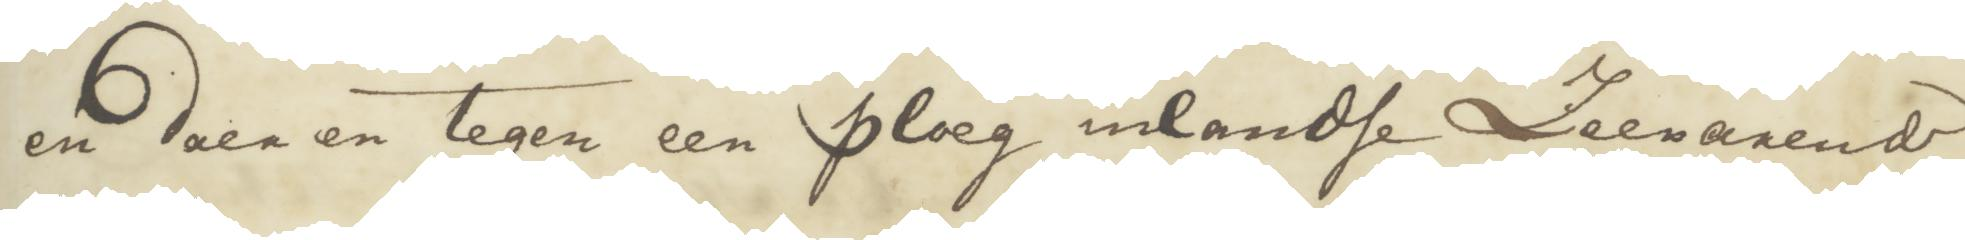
en daer en tegen een ploeg inlandse Zeevarende
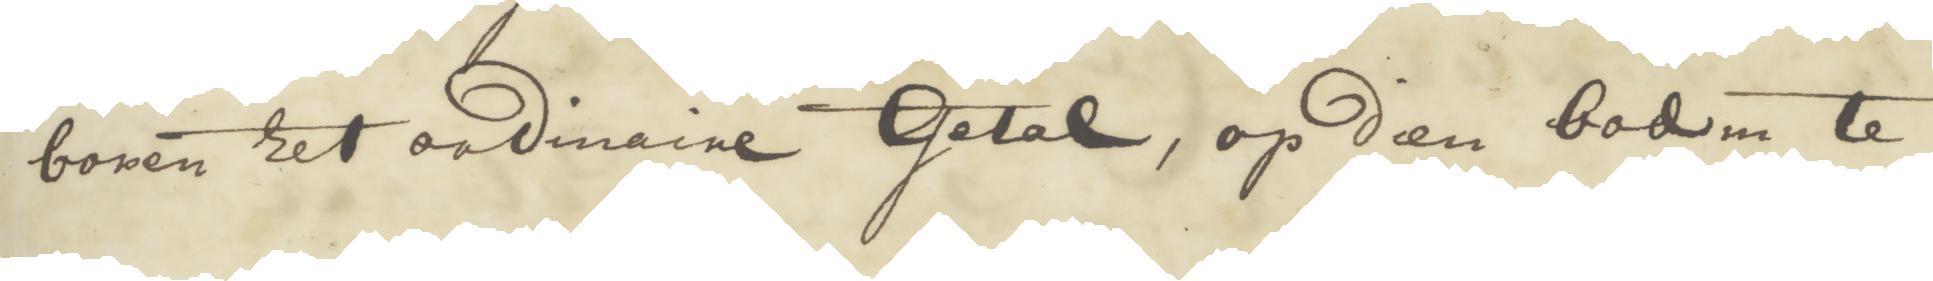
boven het ordinaire Getal, op den bodem te
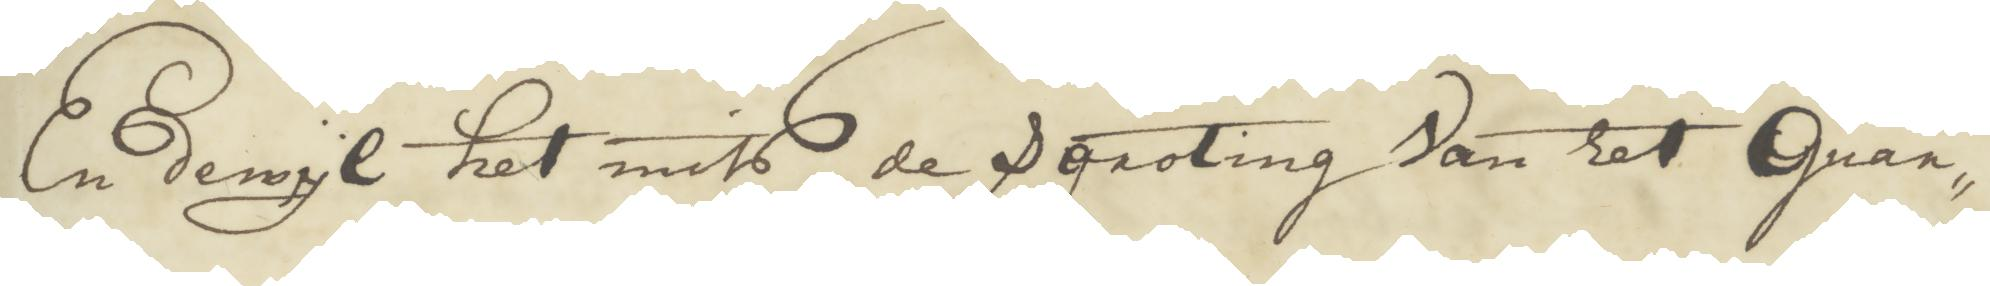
En dewijl het mits de vergroting van het Guar„
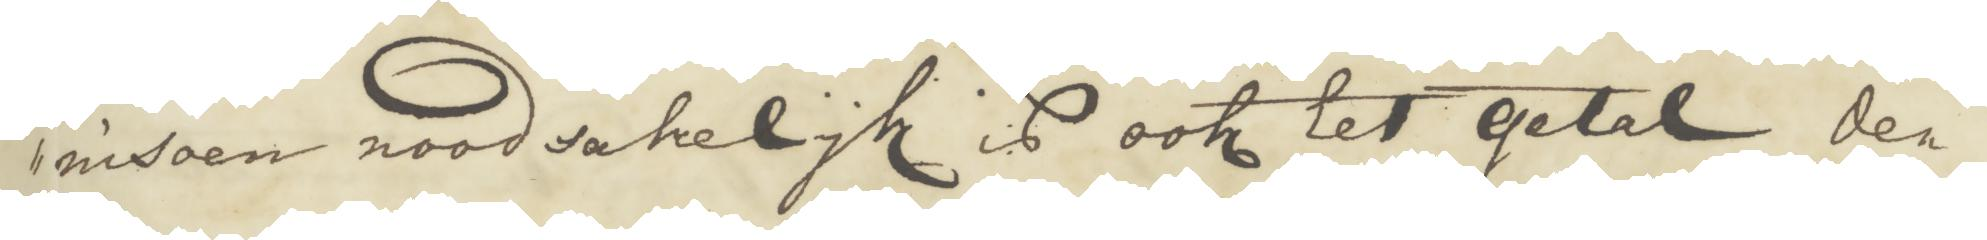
„nisoen noodsakelijk is ook het getal der
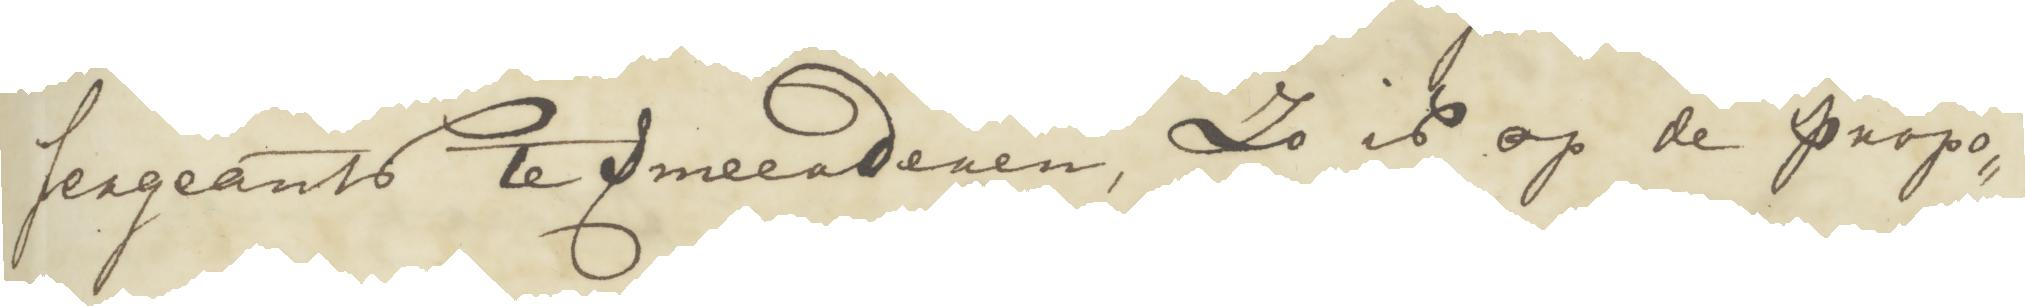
sergeants te vermeerderen, zo is op de propo„
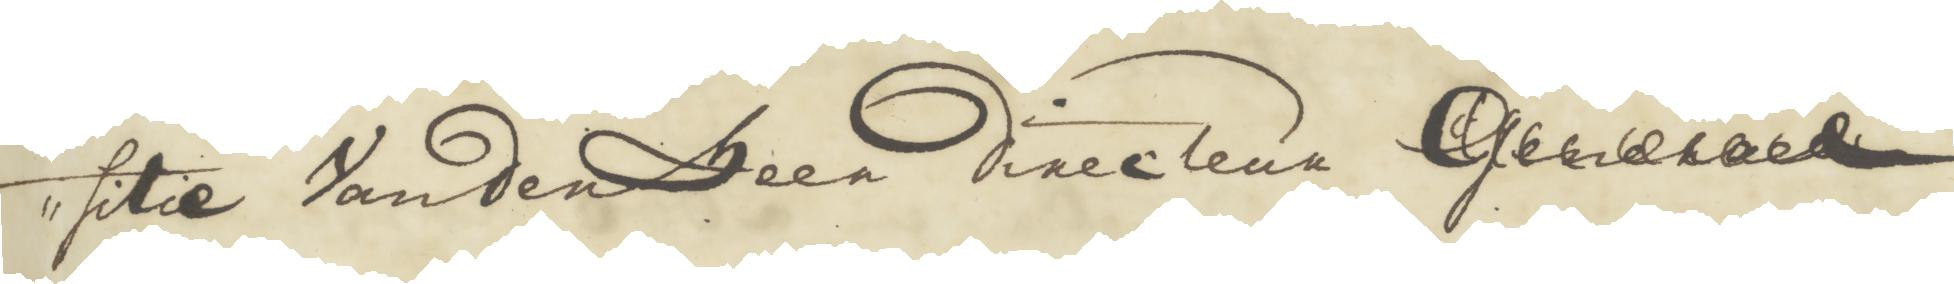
„sitie van den Heer directeur Generael
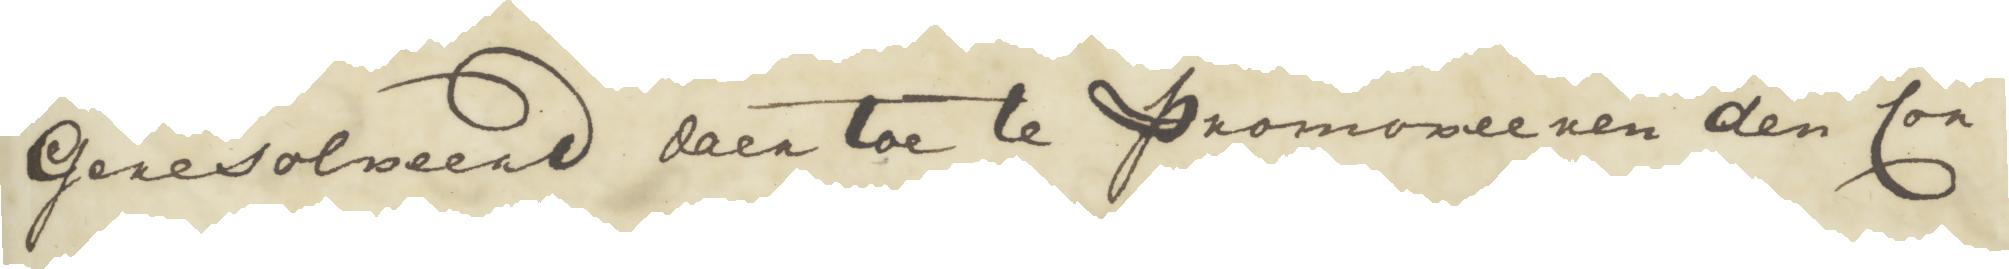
Geresolveerd daer toe te promoveeren den Cor
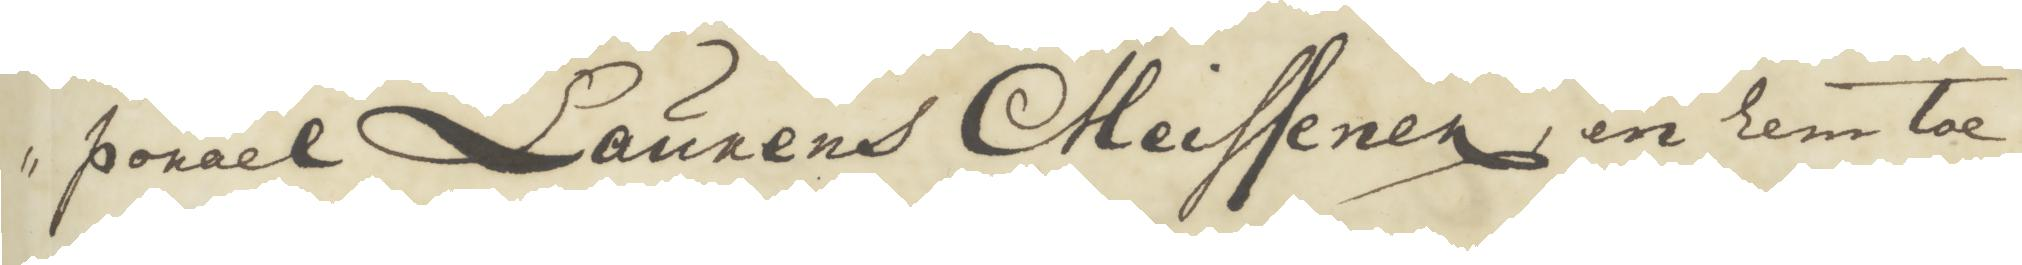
„porael Laurens Meissener, en hem toe
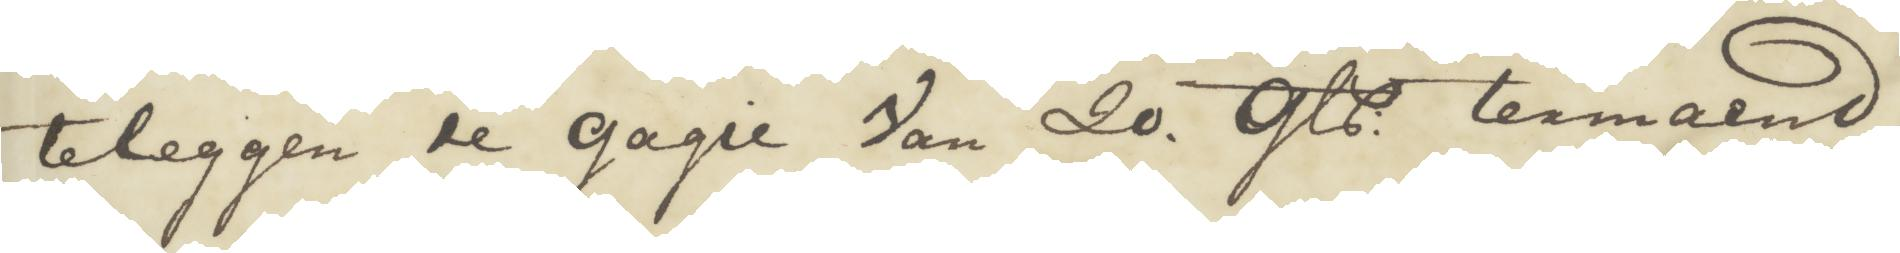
teleggen te gagie van 20. Gls: termaend,
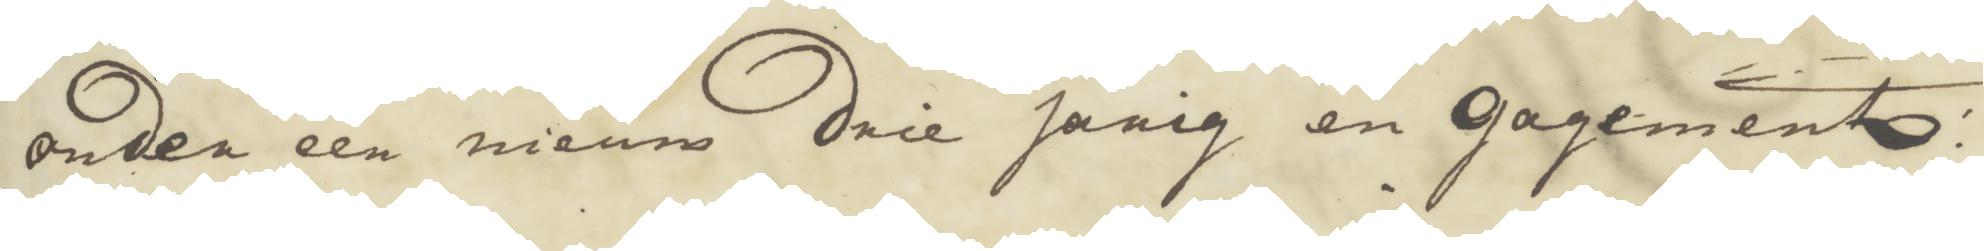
onder een nieuw drie jarig en Gagement:
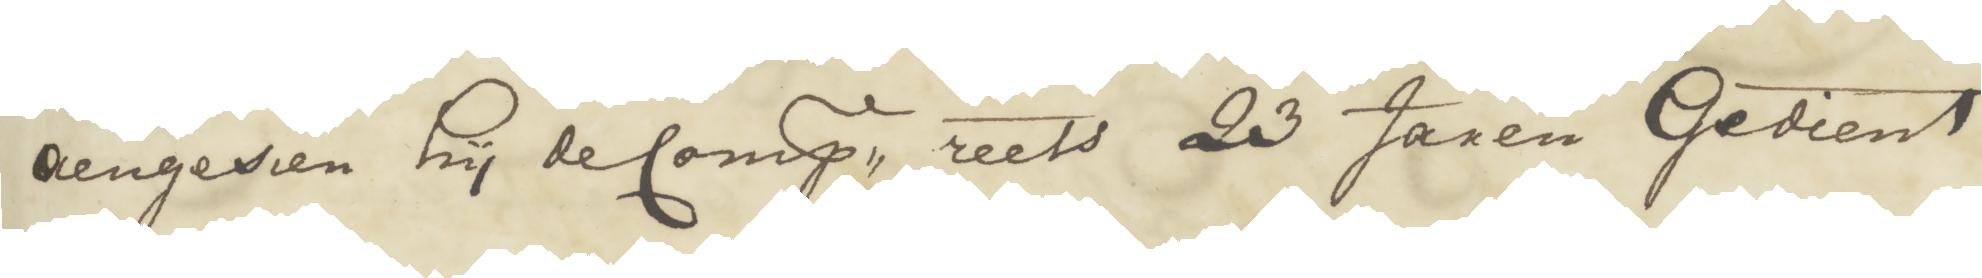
aengesien hij de Comp„e reets 23 Jaren Gedient
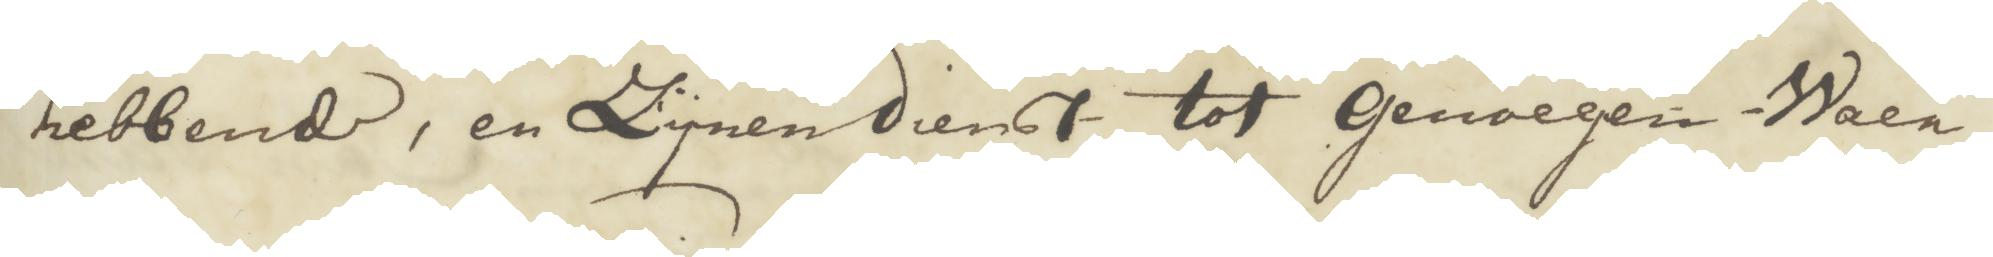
hebbende, en zijnen dienst tot genoegen Waer
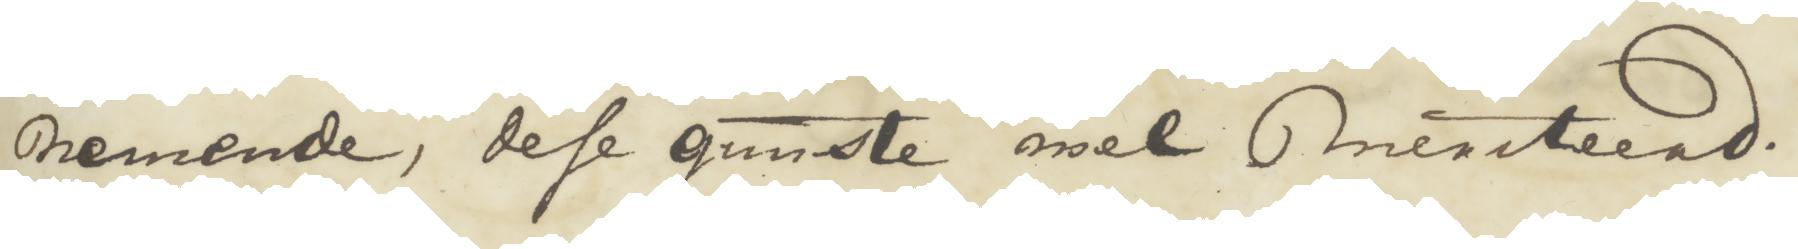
nemende, dese gunste wel Meriteerd.
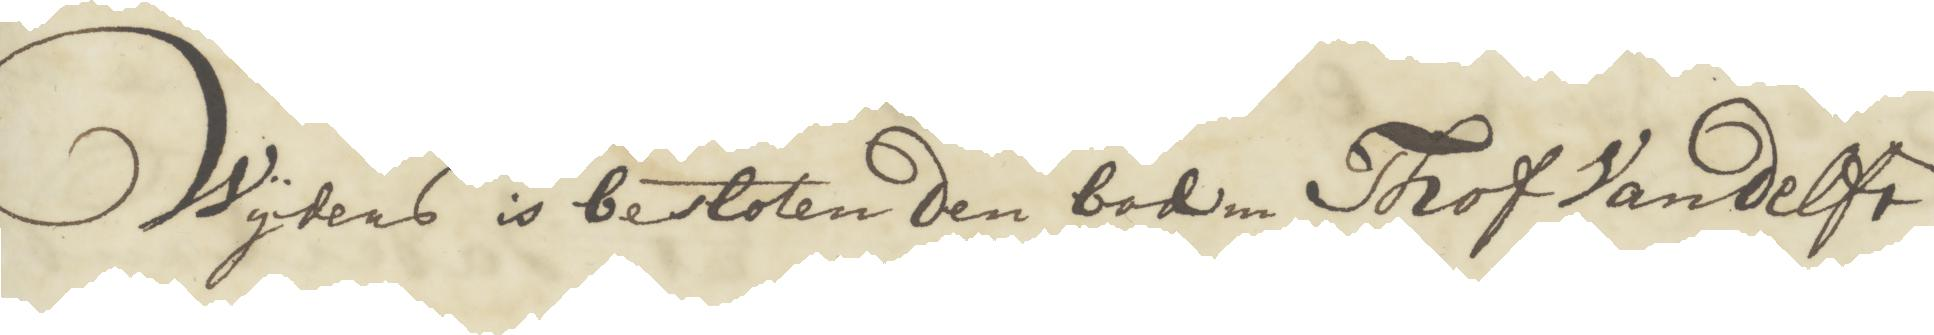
Wijders is besloten den bodem T hof van delft
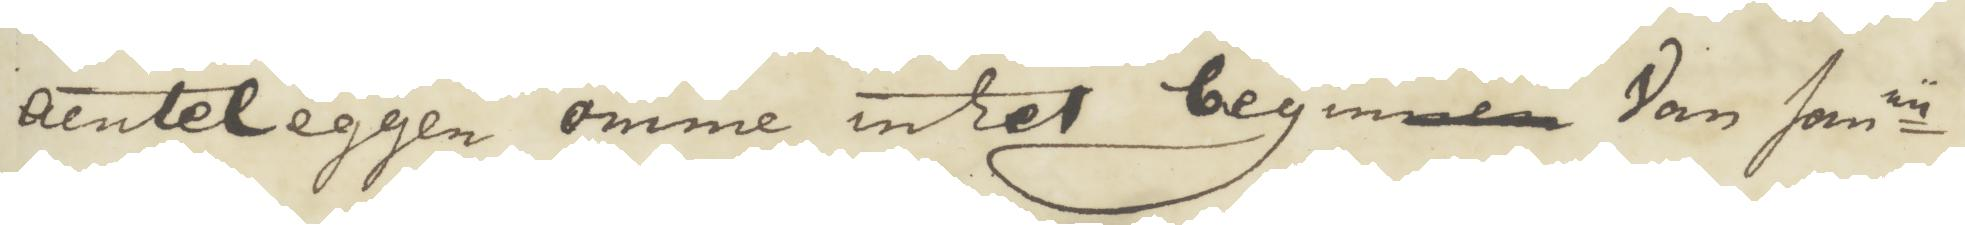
aenteleggen omme inhet beginnen van Jan=rij
